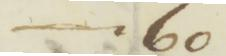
-. 60
